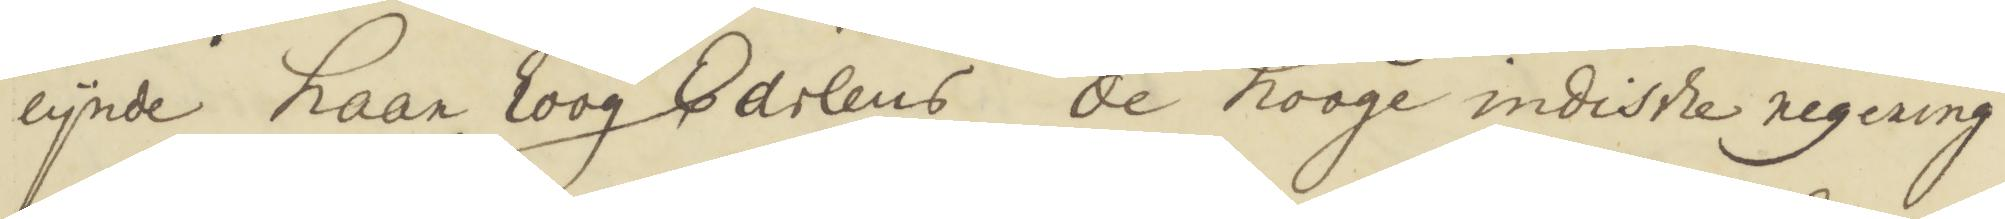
eijnde haar hoog Edelens de hooge indische regering
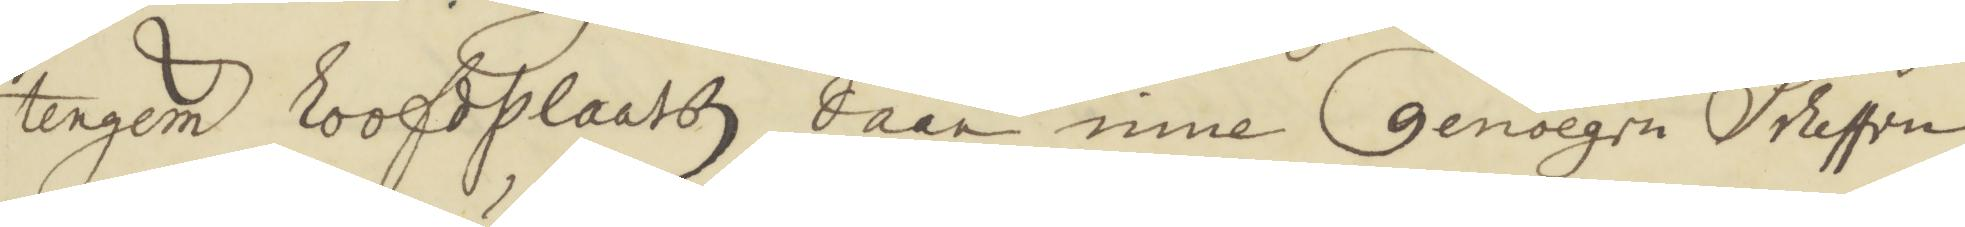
ter gem:e hoofdplaats daar inne genoegen Scheppen
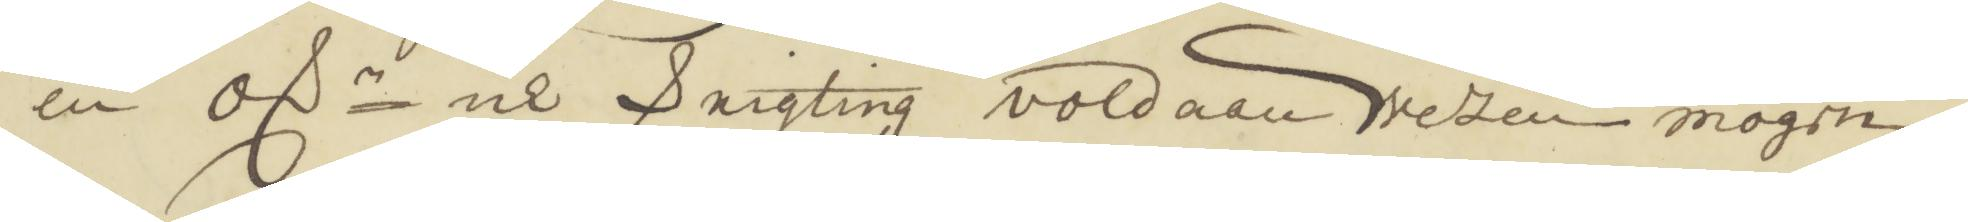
en over=' ue Verrigting voldaan wezen mogen
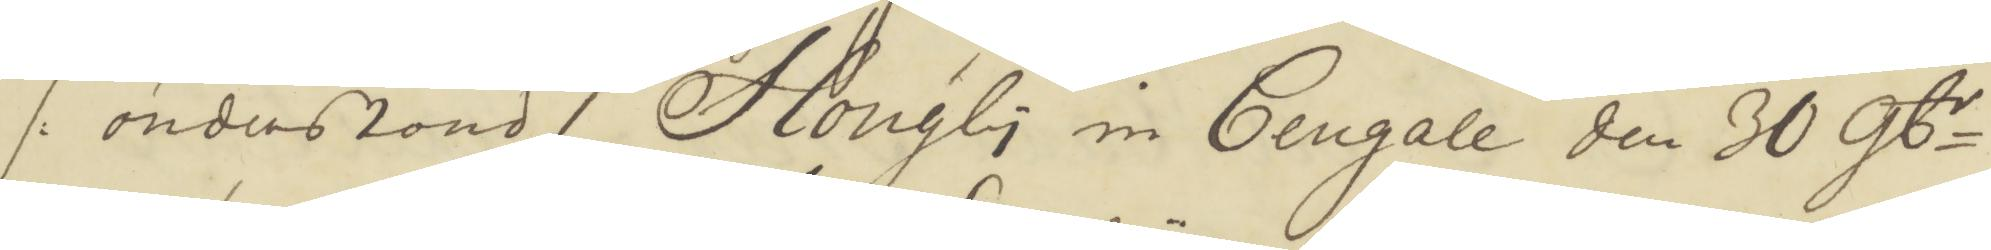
/: onderstond/ Houglij in bengale den 30 9b=r
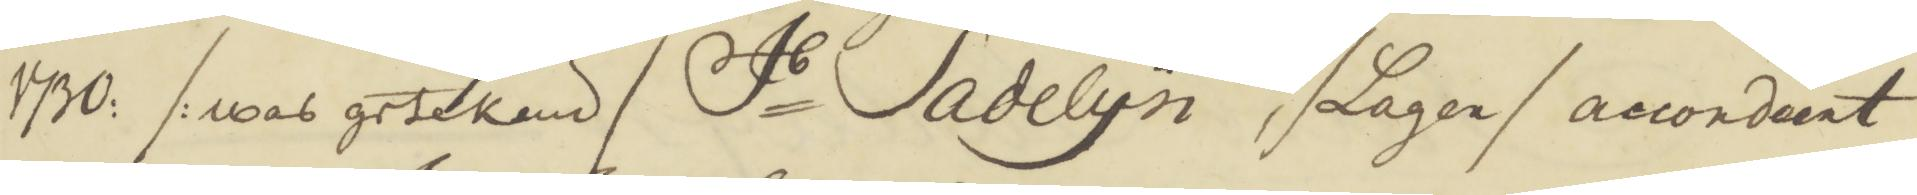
1730: /:was getekend:/ J=b Sadelijn ,/ Lager / accordeert
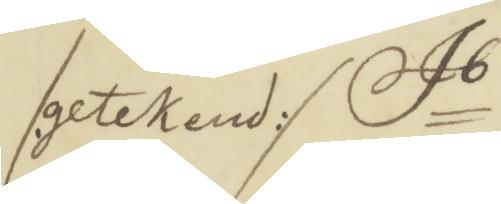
/ getekend :/ J=b J=n
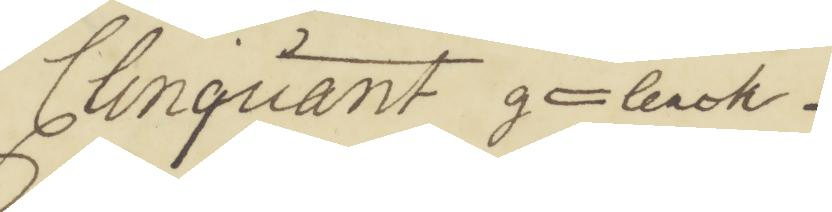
Clinquant g Clerck
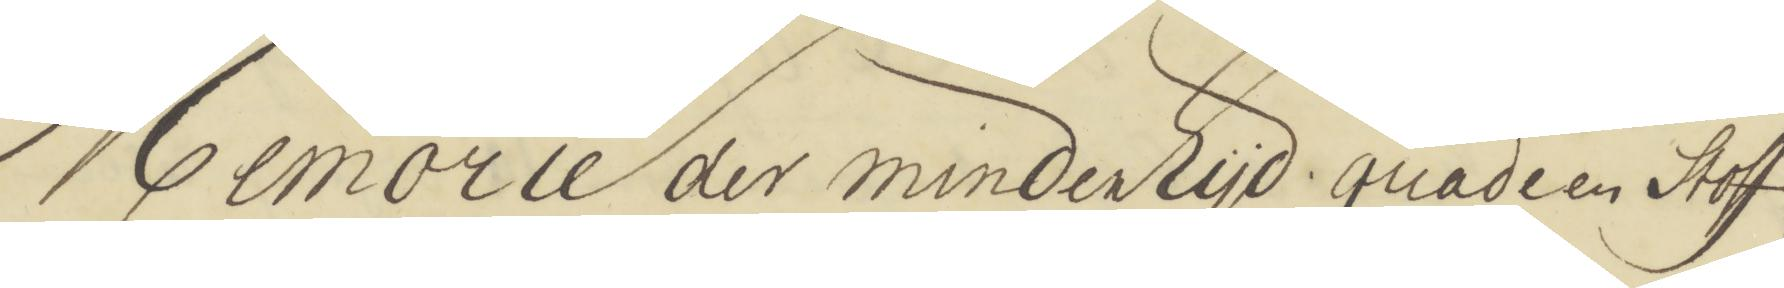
Memorie der minderhijd quade en Stoff
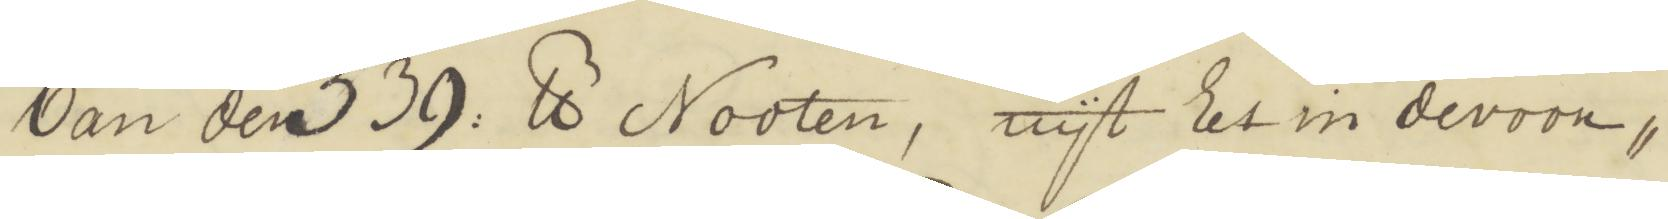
van den 359: lb Nooten, uijt het in devoor„
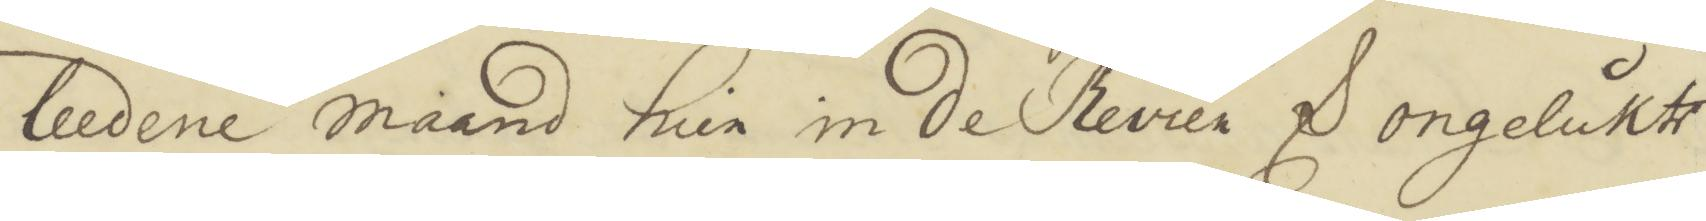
leedene maand hiur in de Revier verongelukt
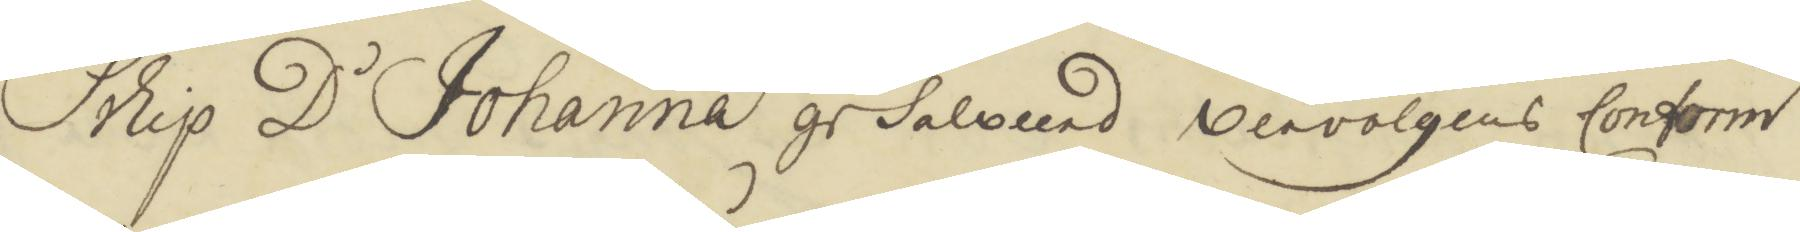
schip D' Johanna gesalveerd vervolgens Conform
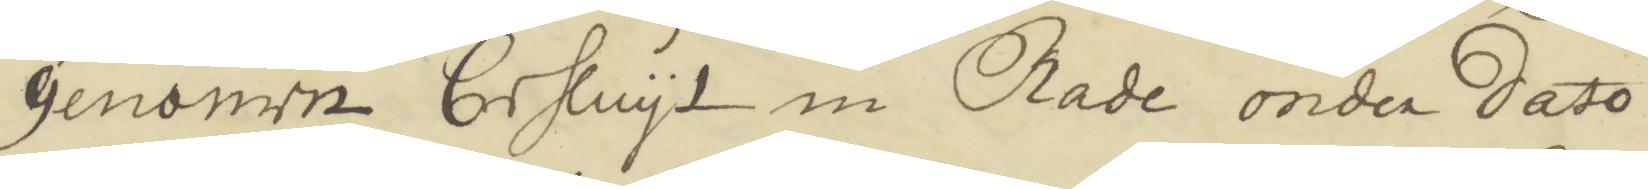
genomen besluijt in Rade onder dato
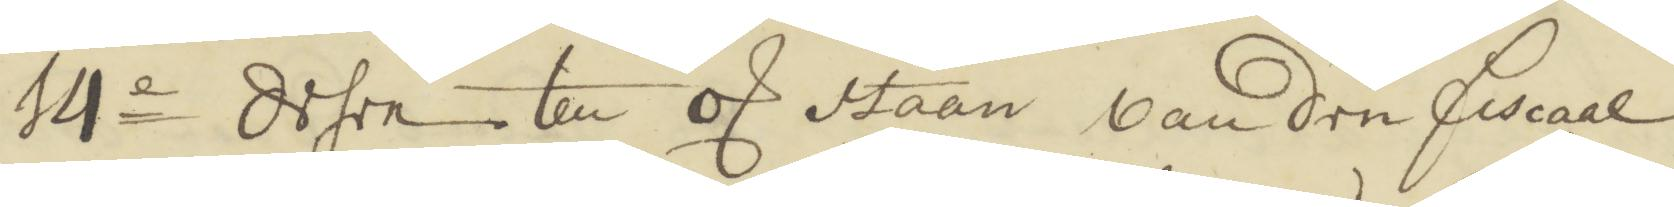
14=e deser ten over staan van den fiscaal
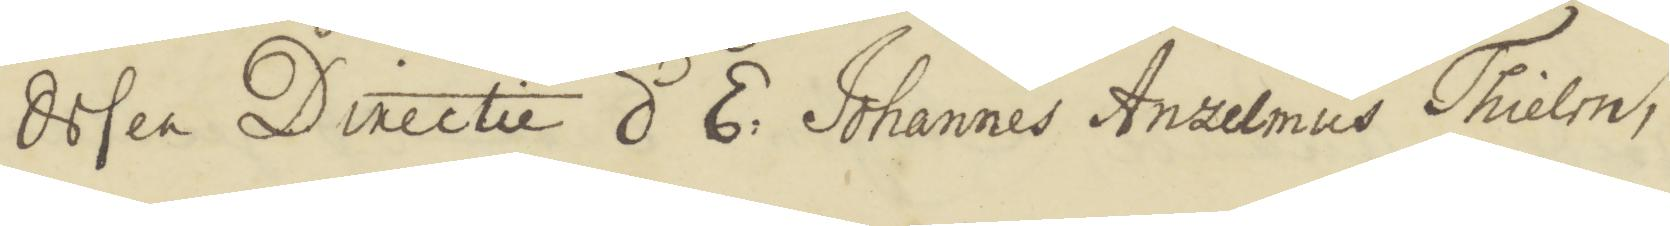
deser Directie d’ E: Johannes Anzelmus Thielen
